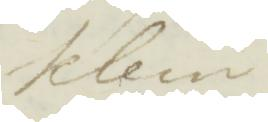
klein
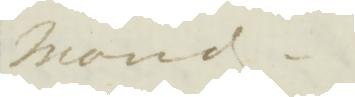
mond -
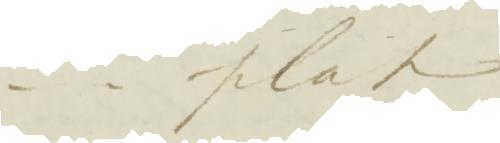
- - plat
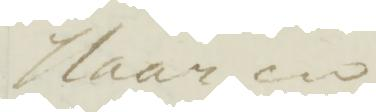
Haar en
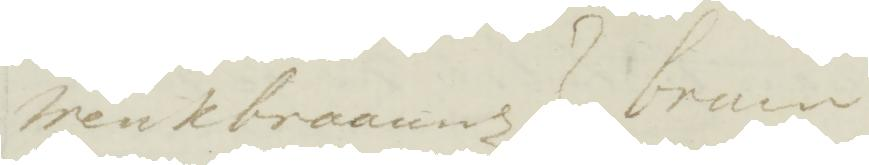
wenkbraauwen bruin
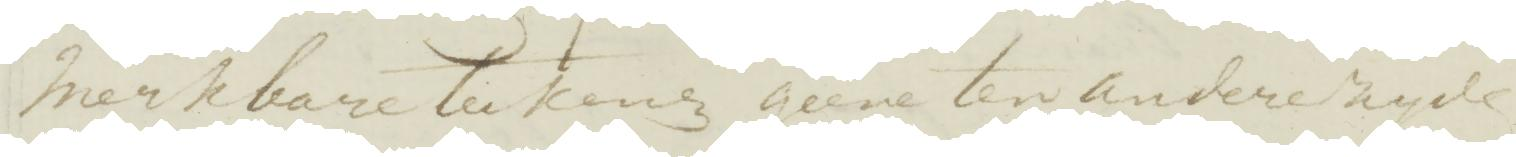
merkbare teekenen geene ten andere zyde
